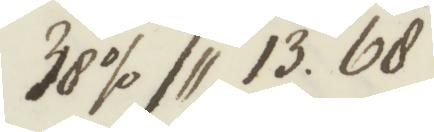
38% „ 13. 68
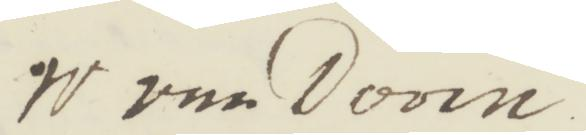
W van Doorn
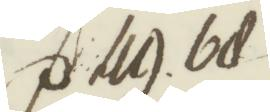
ƒ 49. 68
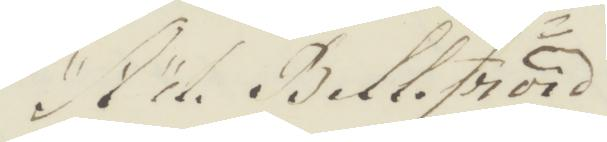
J." A." Bellefroid
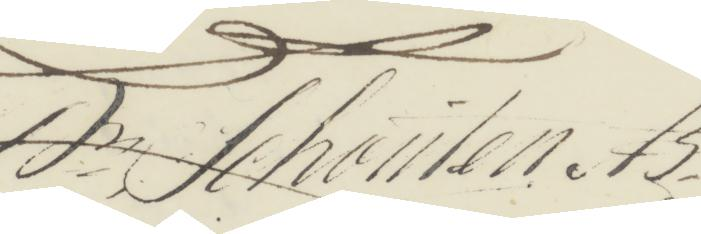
P-r Schouten Ah.en
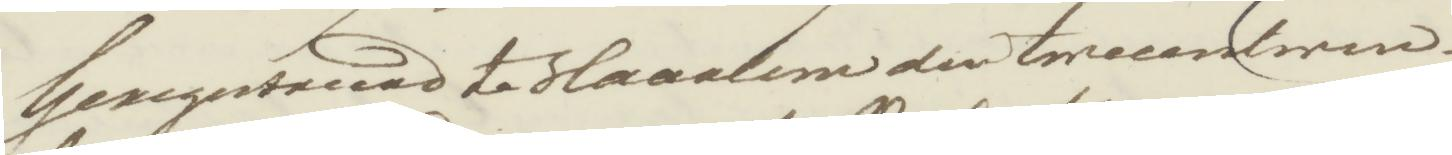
Geregistreerd te Haarlem den tweeentwin–
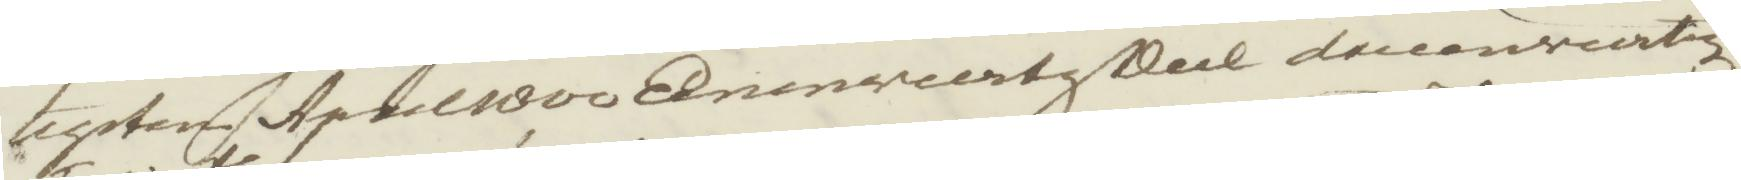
tigsten April 1800 Eenenveertig deel drieenveertig
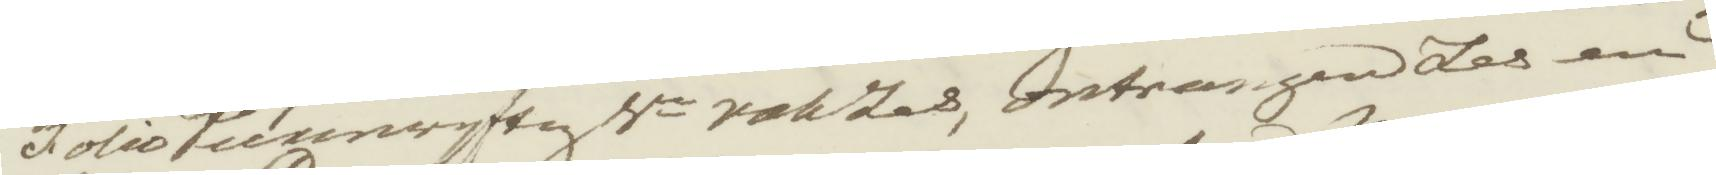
Folio Vierenvyftig V-o vak zes, ontvangen zes en
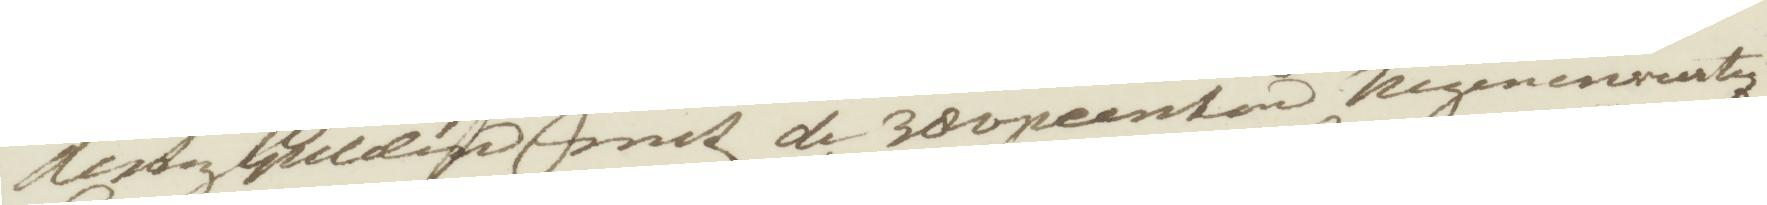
dertig Gulden met de 38 opcenten negenenveertig
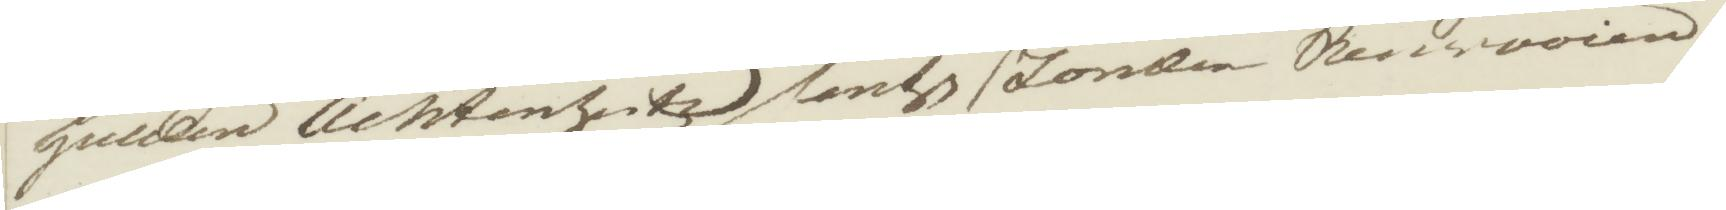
Gulden Achtenzestig Cenen / zonder Renvooien.
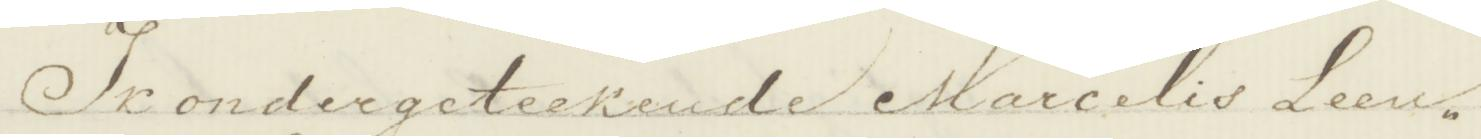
Jk ondergeteekende Marcelis Leen„
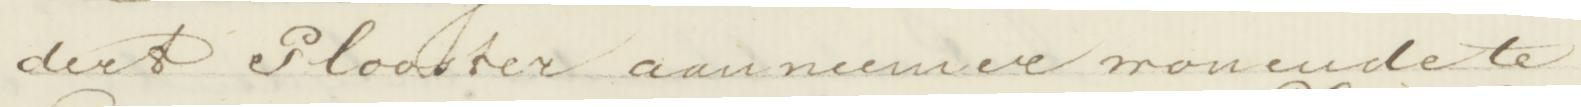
=dert Plooster aanneemer wonende te
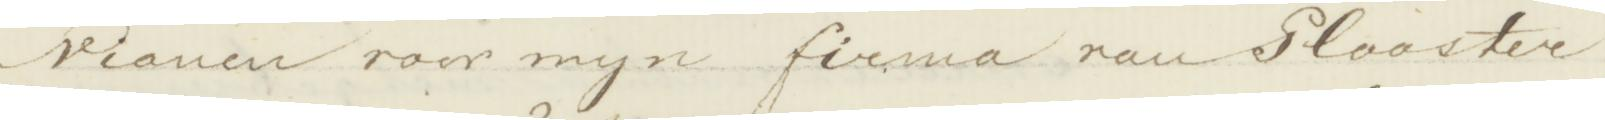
Vianen voor myn firma van Plooster
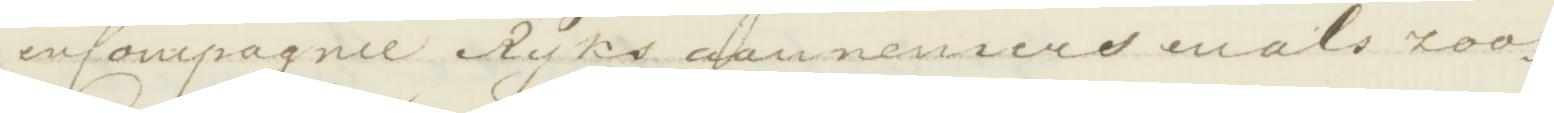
en Compagnie Ryks aannemers en als zoo,
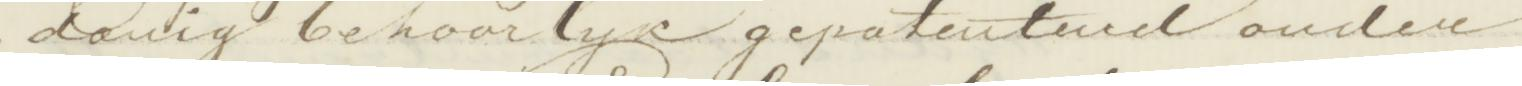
,danig behoorlyk gepatenteerd onder
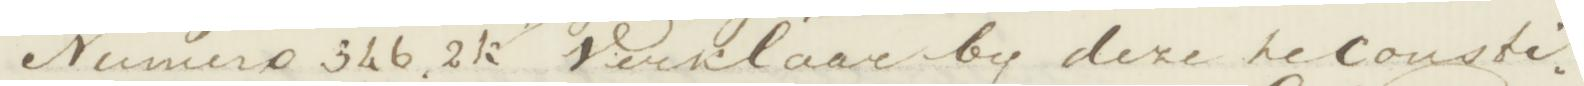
Numero 346. 2k Verklaar by deze te consti,
